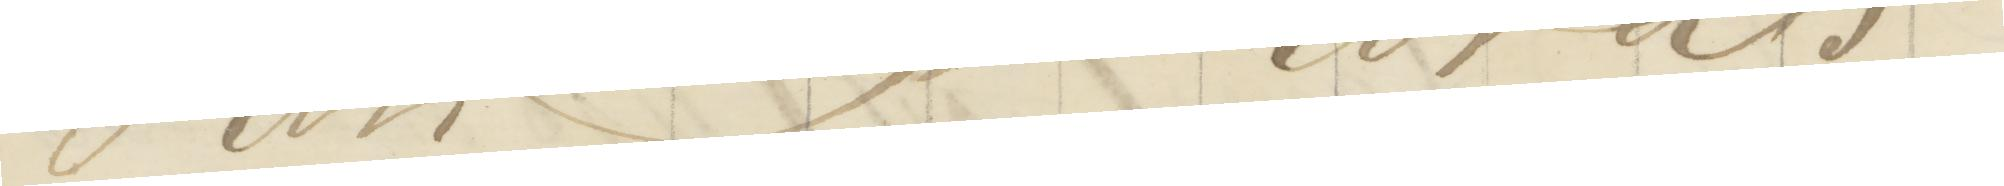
Van Iavas
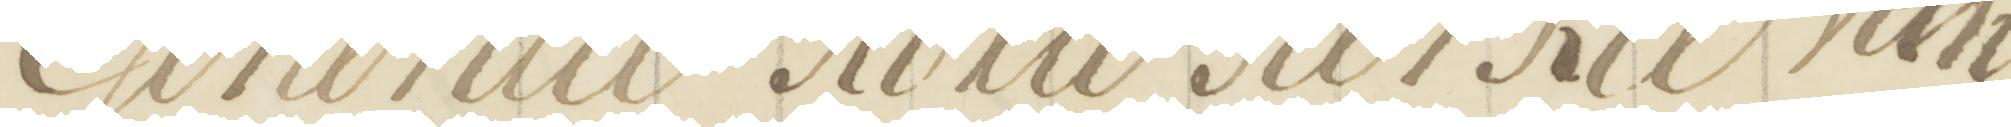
Generale Korte sterkte van
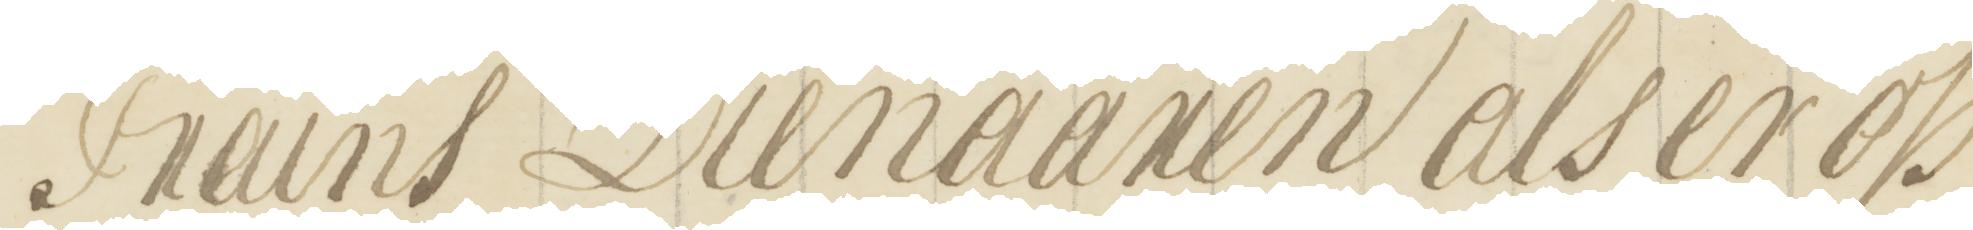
Trains Dienaaren als er op
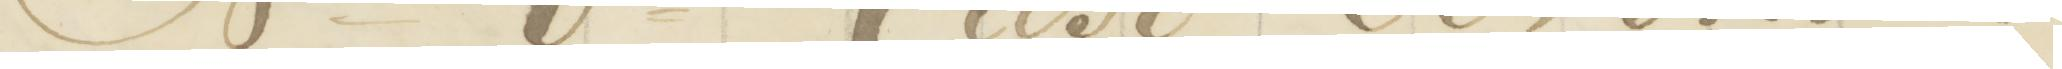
N=t O=st Cust bevonden
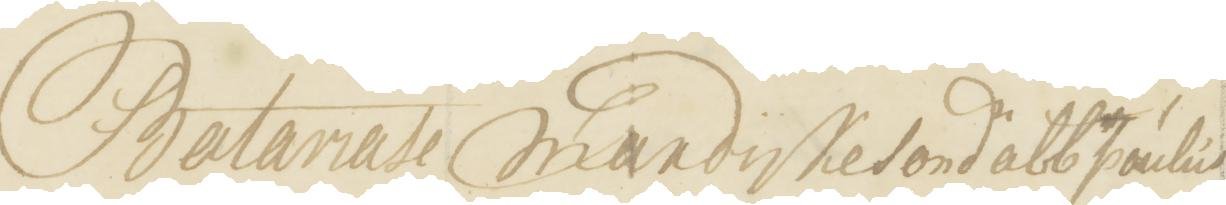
Bataviase mardijkes ondr abbt paulus
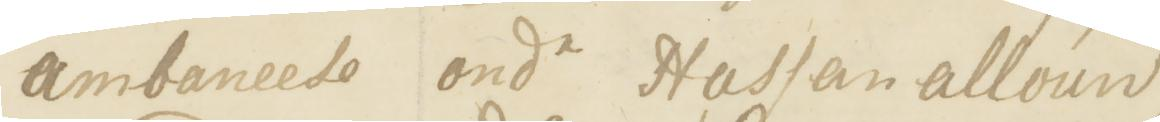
ambaneese ondr Hassan alloun
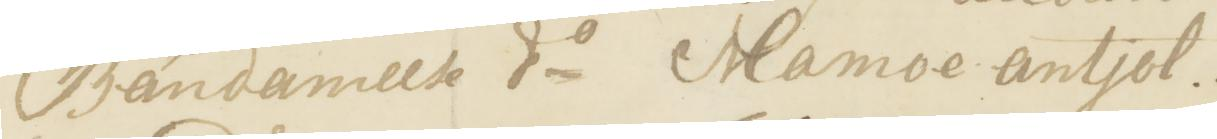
Bandameese d=o Mamoe antjol .
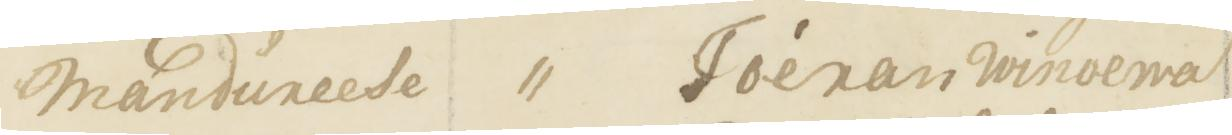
mandureese „ Toeran winoewa
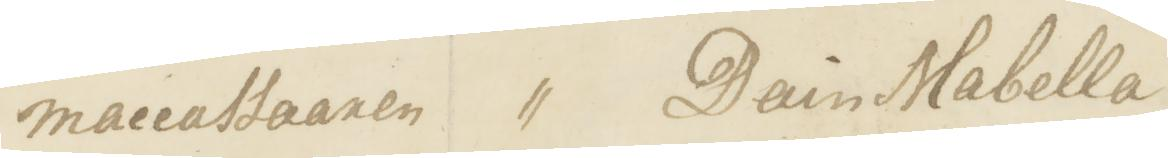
maccassaaren „ Dain Mabella
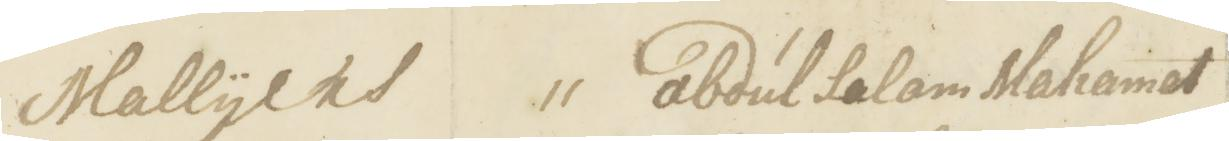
Mallijers „ abdul salam Mahamet
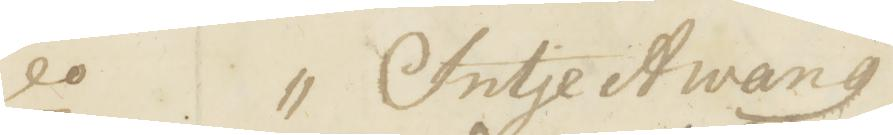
_-o „ Intje Awang
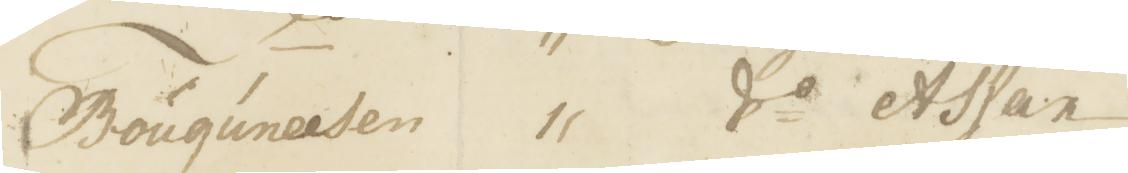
Bouguneesen „ d=o Assar
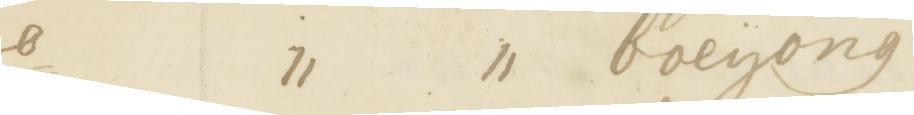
=o „ „ boeijong
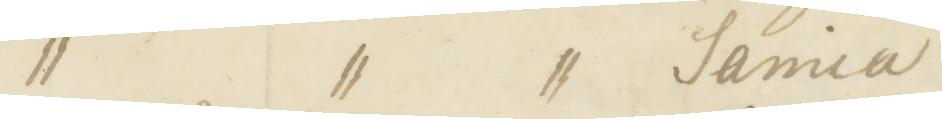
„ „ „ samia
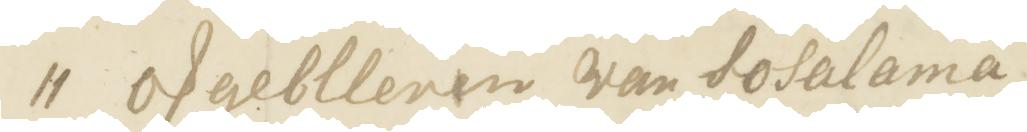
„ overgebleven van sosalama
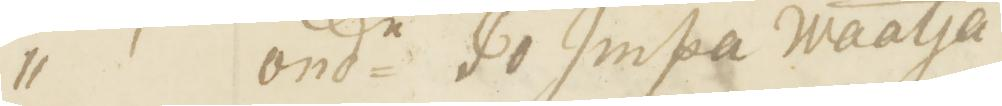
„ ond=r To Jmpa waatja
